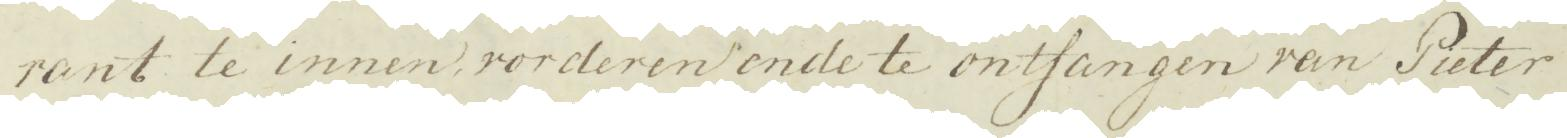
rant te innen, vorderen ende te ontfangen van Pieter
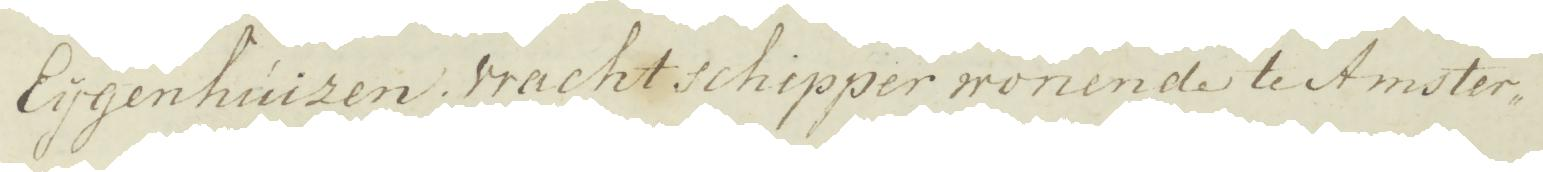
Eijgenhuizen, vrachtschipper wonende te Amster„
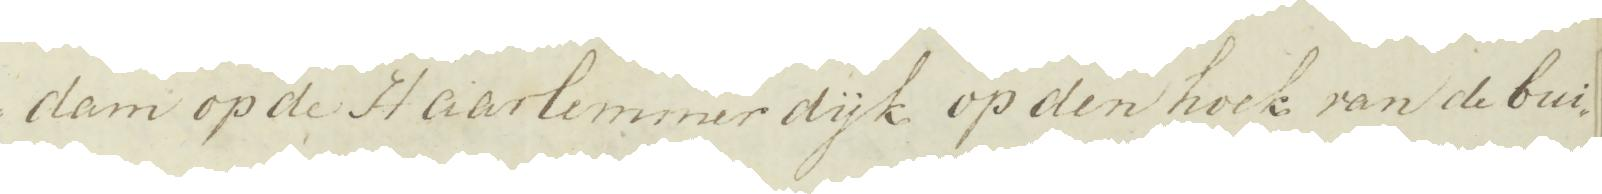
„dam op de Haarlemmer dijk op den hoek van de bui„
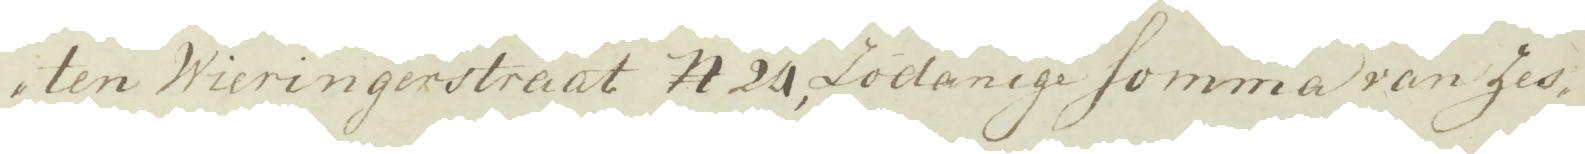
„ten Wieringerstraat N 24, Zodanige somma van Zes„
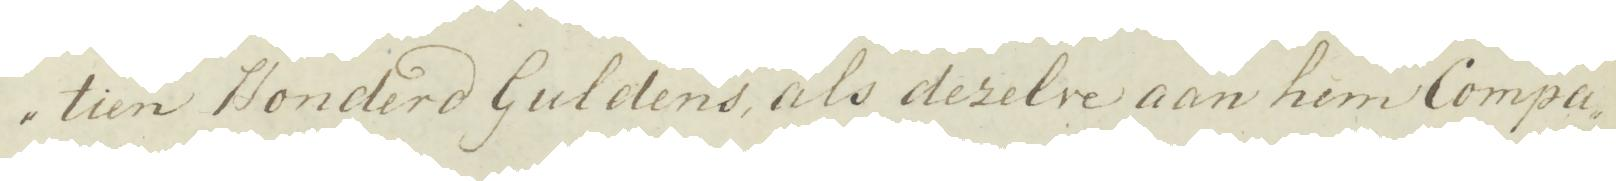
„tien Honderd Guldens, als dezelve aan hem Compa„
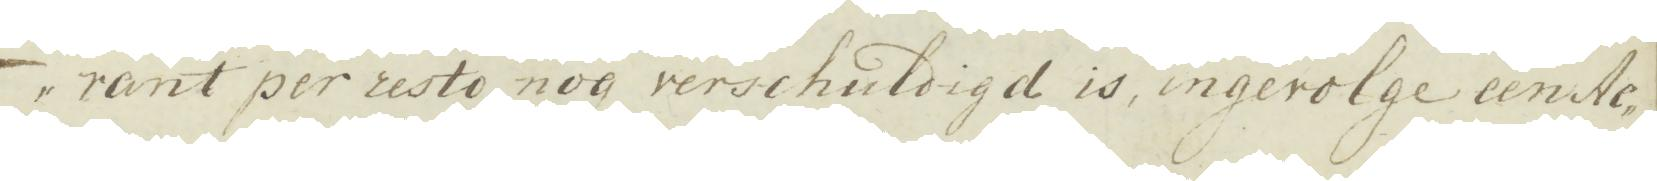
„rant per resto nog verschuldigd is, ingevolge een Ac„
